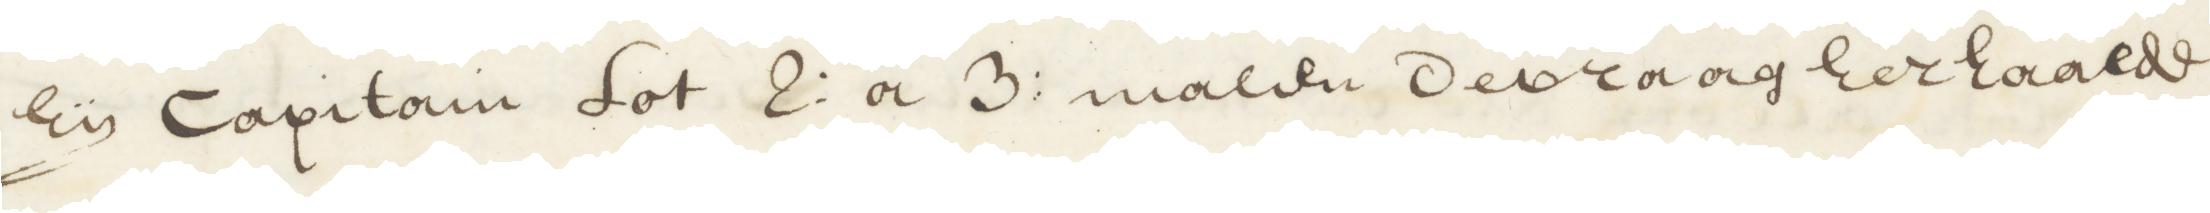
hij Capitain tot 2: â 3: malen de vraag herhaalde
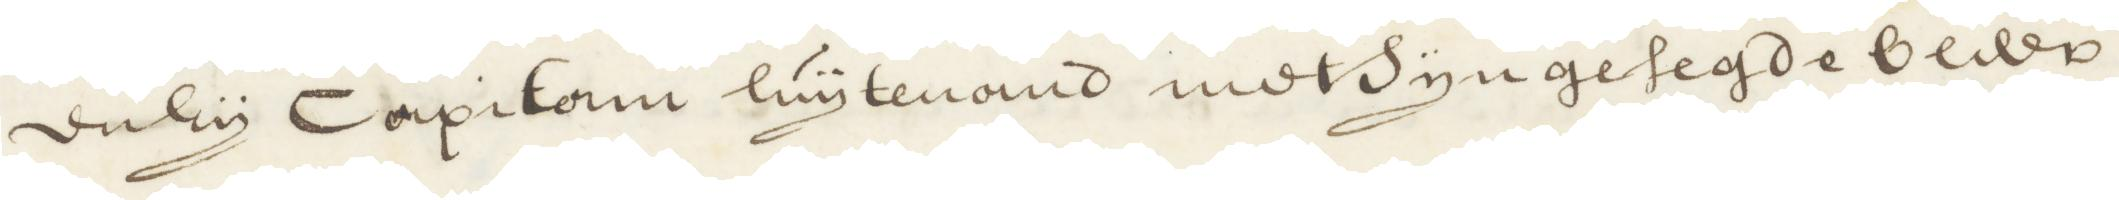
en hij Capitan luijtenand met sijn gesegde bleev
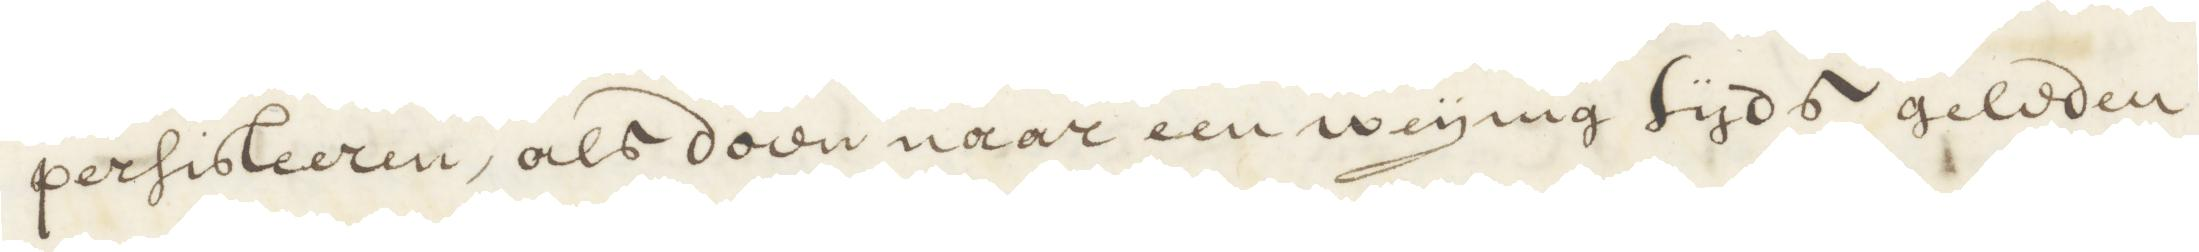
persisteeren, als doen naar een weijnig tijds geleden
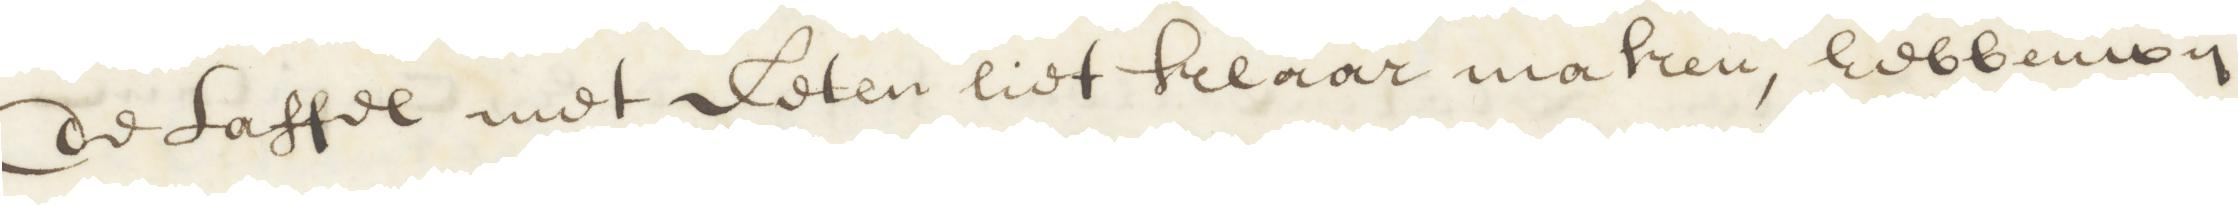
de taffel met Eeten liet klaar maken, hebben wij
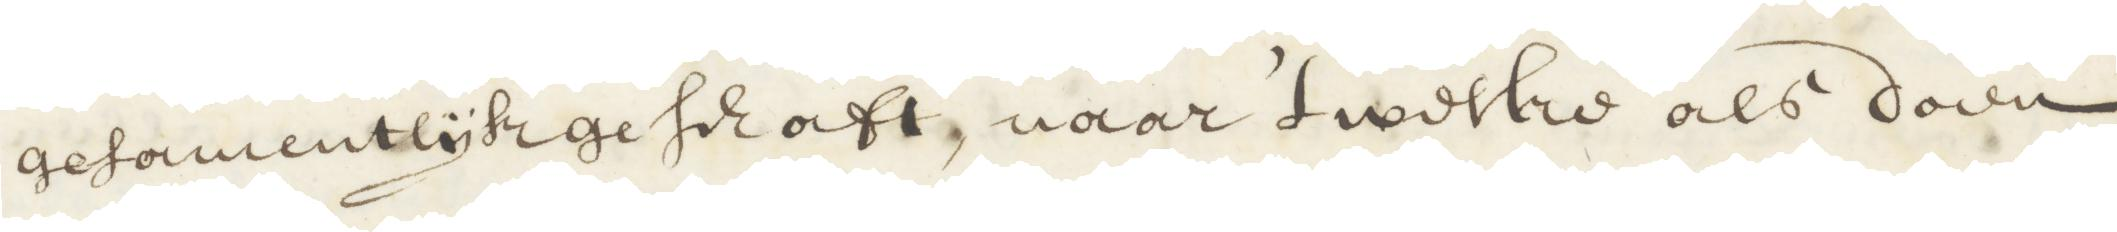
gesamentlijk geschaft, naar 'twelke als doen
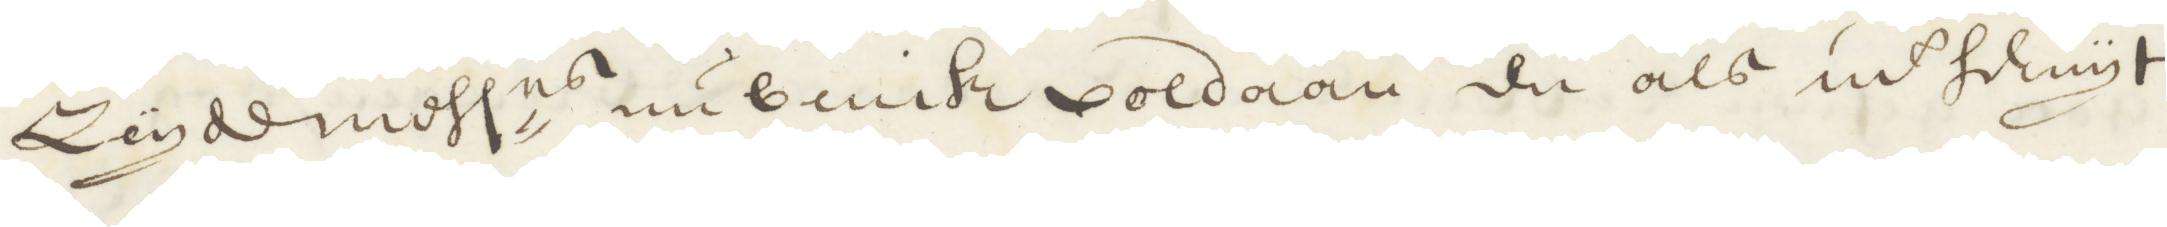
zeijde mess„ns nu ben ik voldaan en als uE schuijt
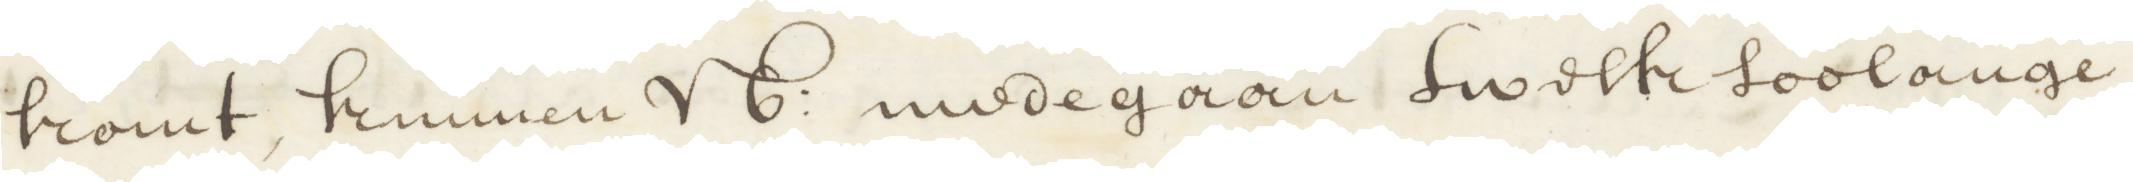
komt, kunnen UE: medegaan 'twelk soolange
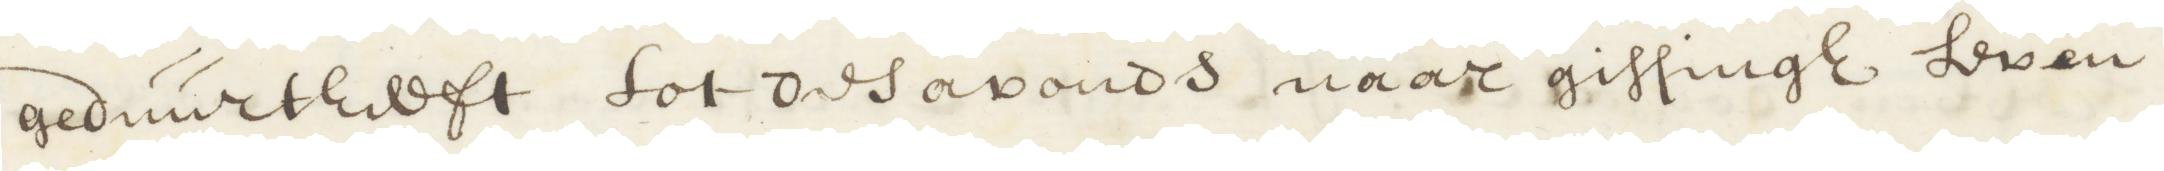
geduurt heeft tot des avonds naar gissingh seven
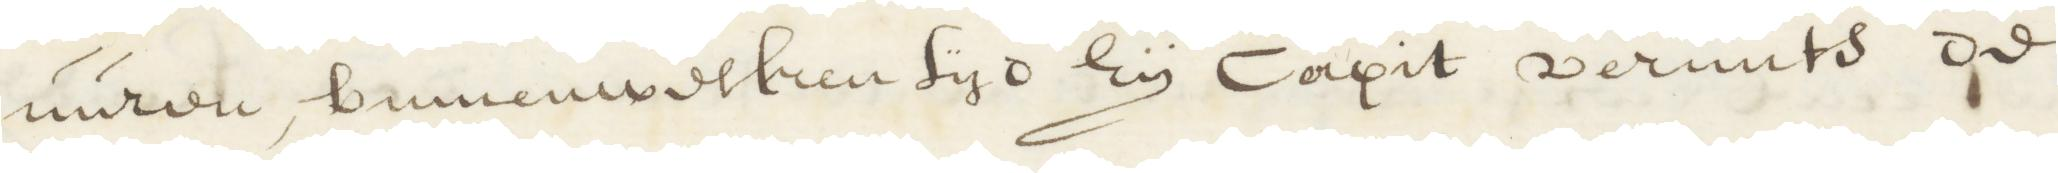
uuren, binnenwelken tijd hij Capit vermits de
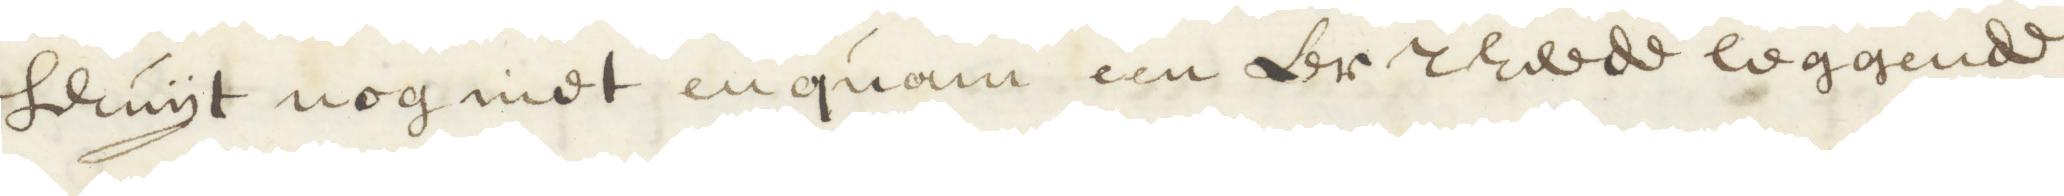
schuijt nog niet en quam een ter rheede leggende
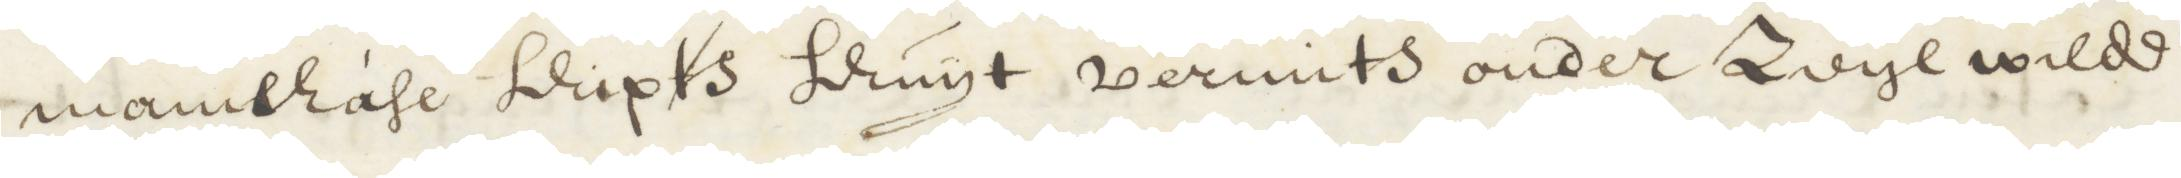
manilhase schipte schuijt vermits onder zeijl wilde
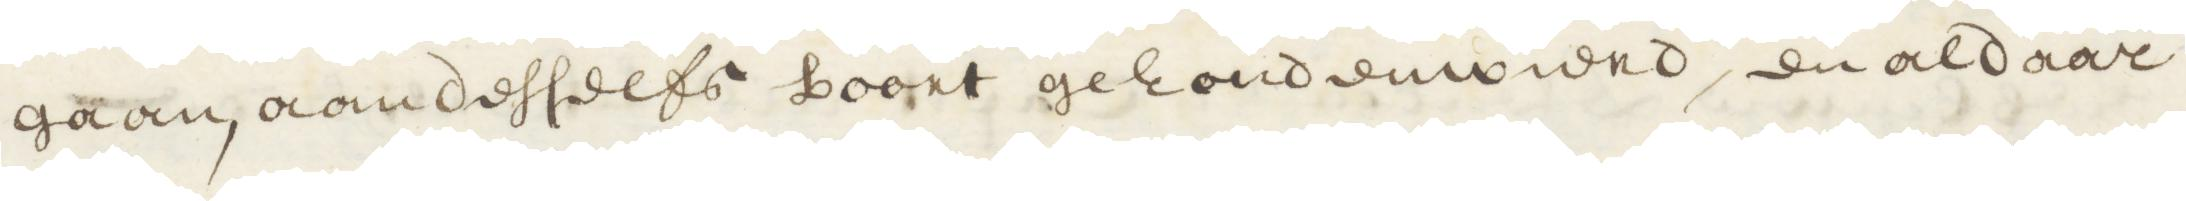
gaan, aan desselfs boort gehouden wierd, en aldaar
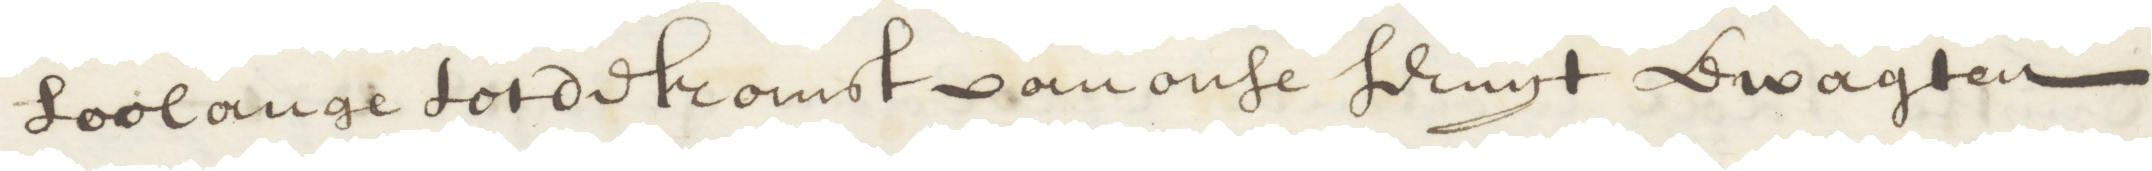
soolange tot de komst van onse schuijt te wagten
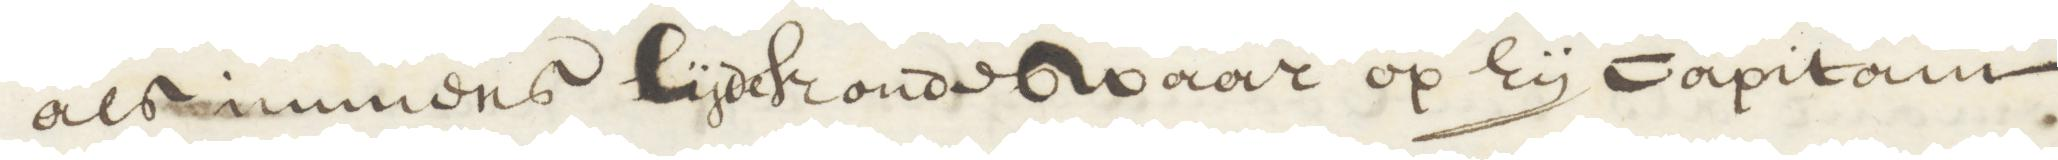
als immers tijde konde waar op hij capitain
